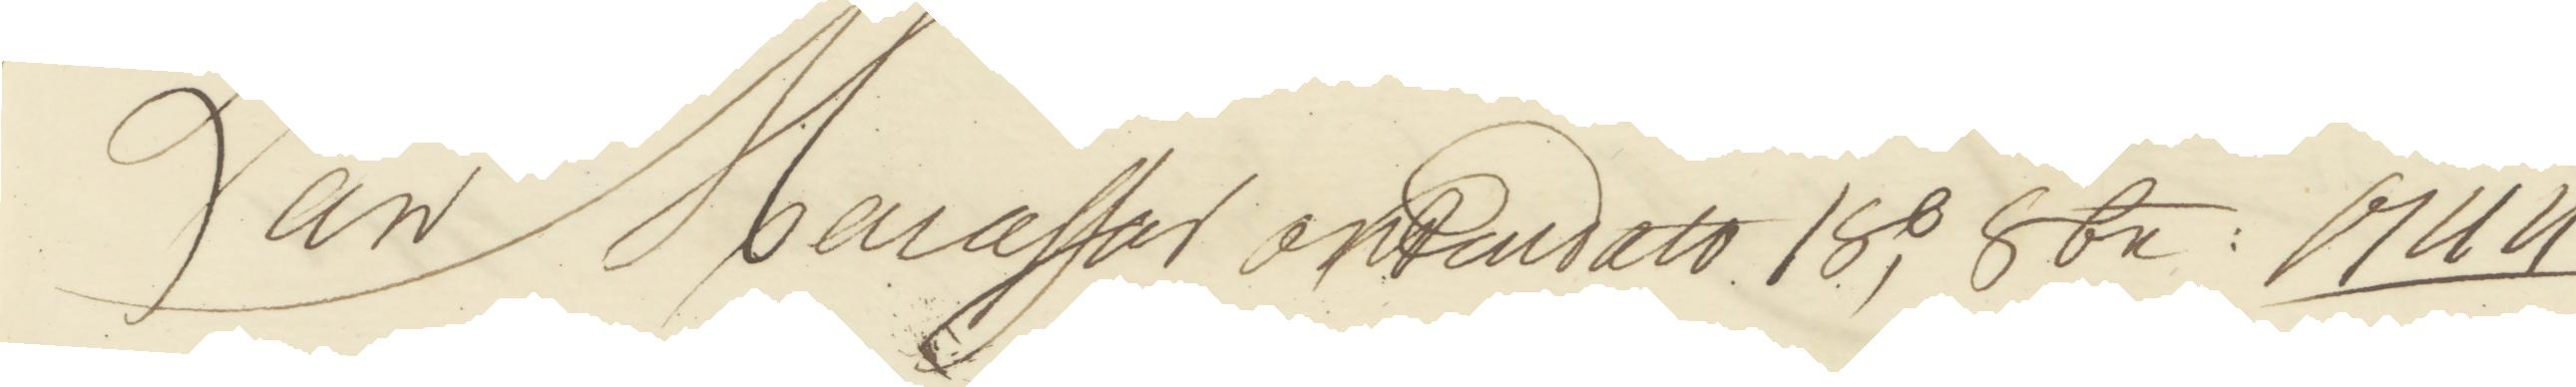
Van Macassar onderdato 18,e 8br: 1744
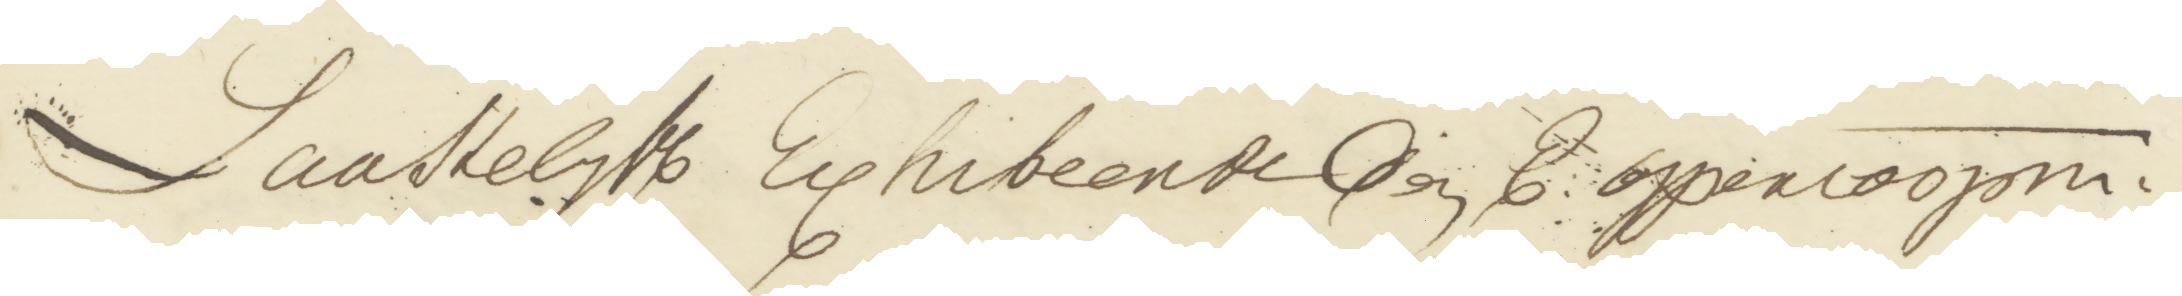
Laastelijk Exhibeerde den E: oppercoopm,
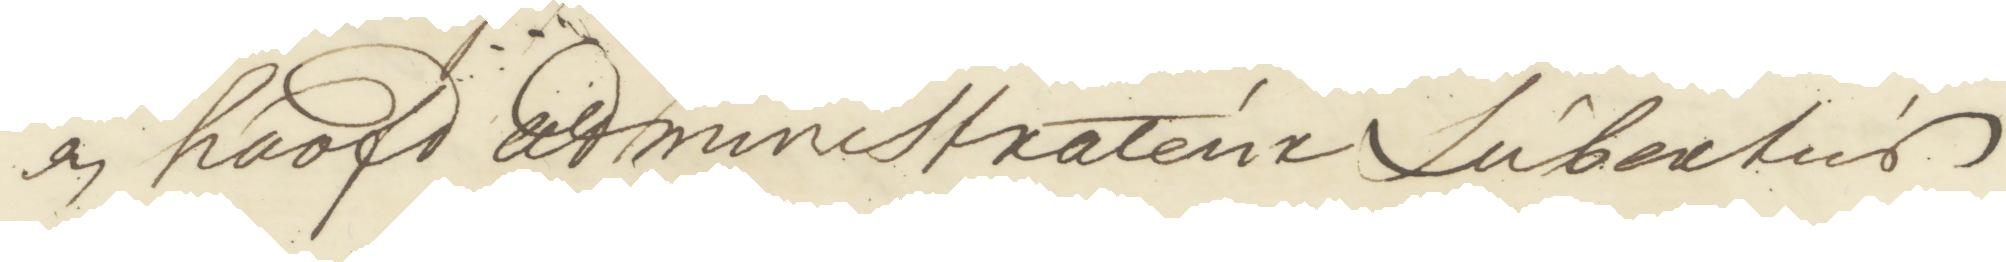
en hoofd administrateur Lubertus
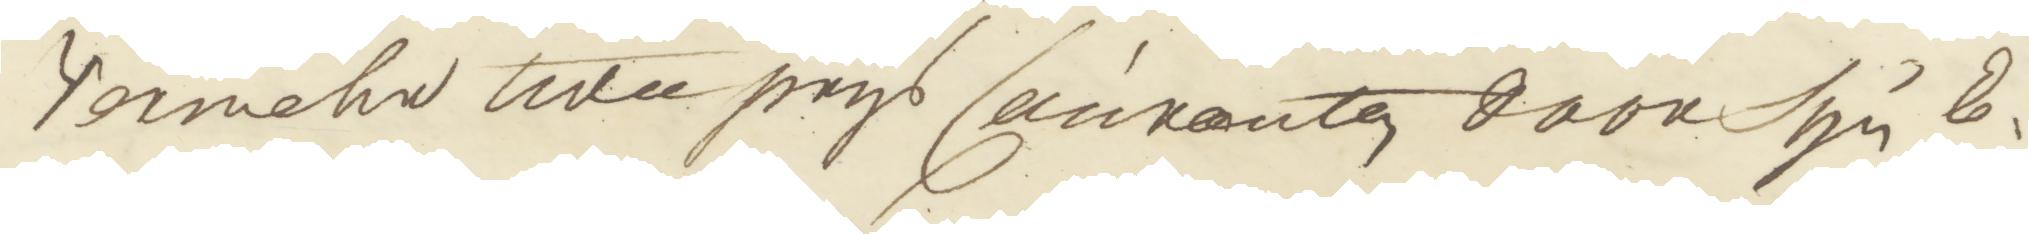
Vermehr twee prijs Couranten door sijn E:
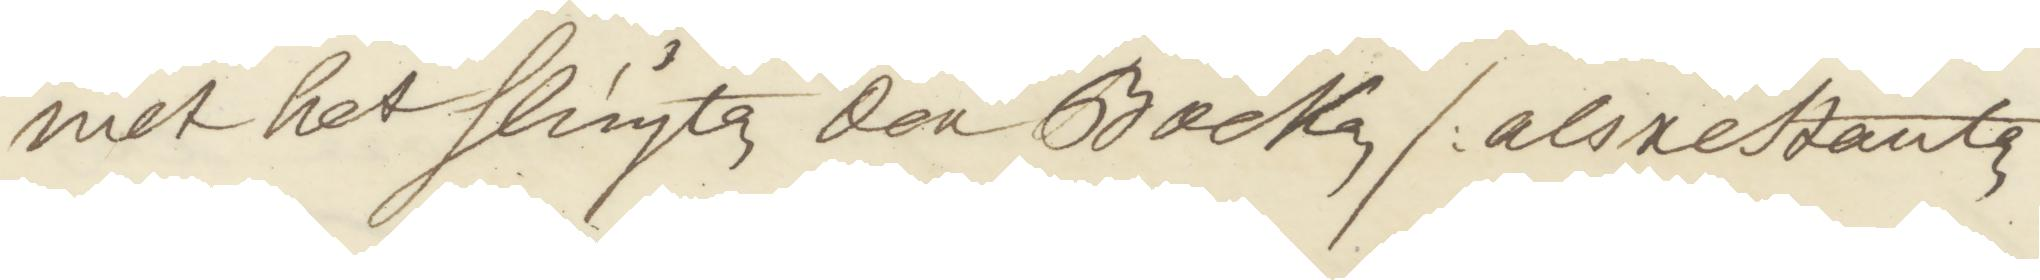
met het sluijten der Boeken /:als restanten
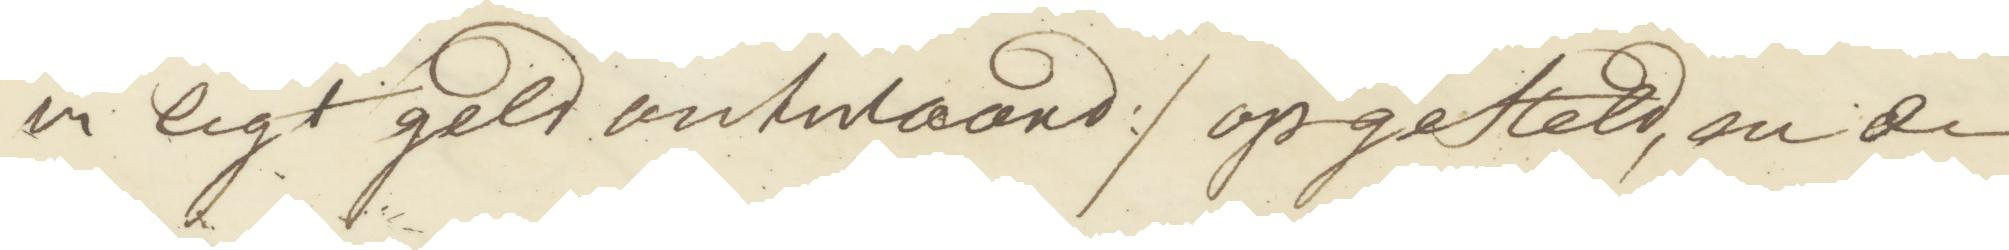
in ligt geld ontwaard:/ opgesteld, en de
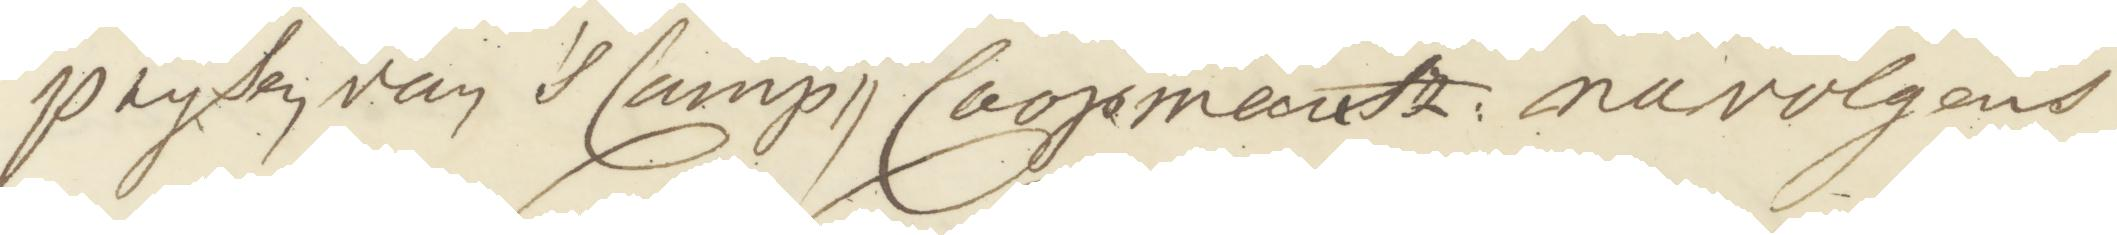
prijsen van ’s Comp„s Coopmansz: na volgens
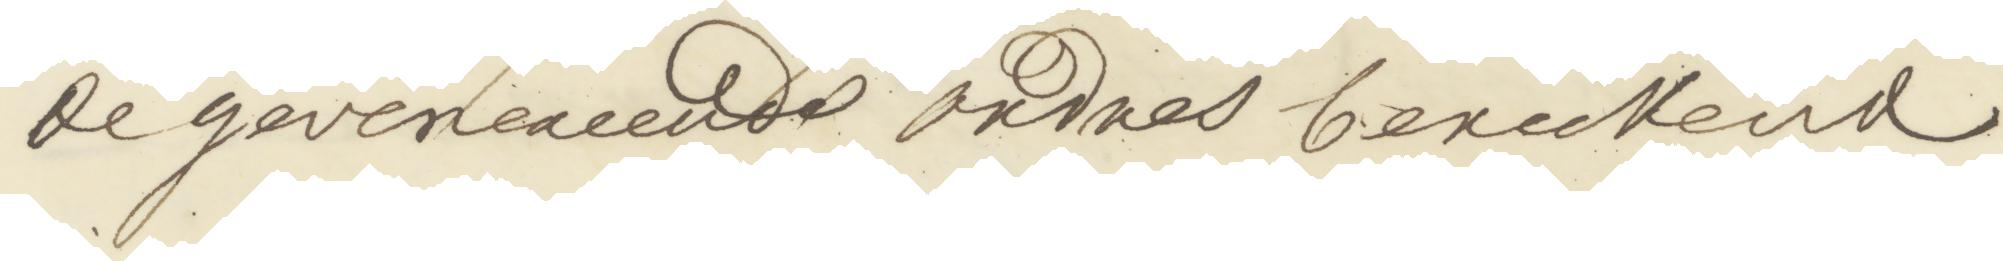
de gevenereerde ordres bereekend
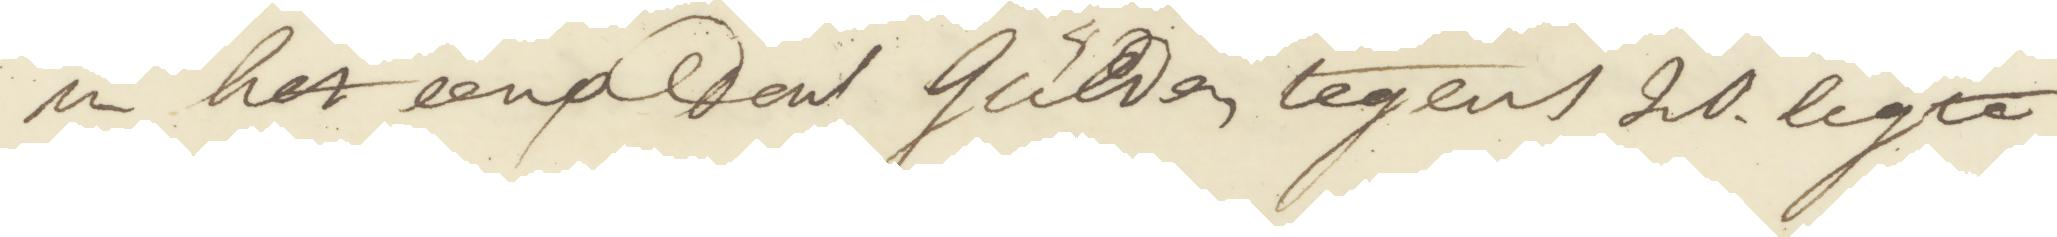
in het een guldens gulden tegens 20. ligte
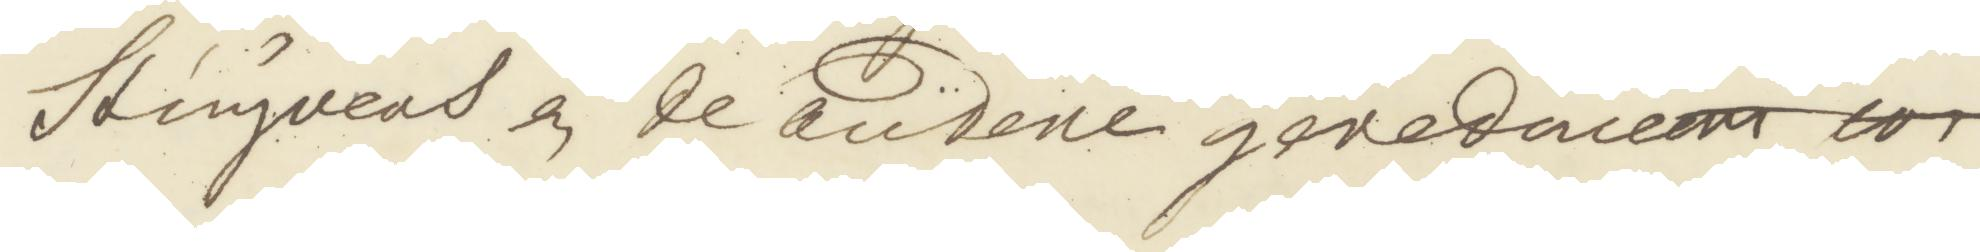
stuijvers en de andere gereduceert tot
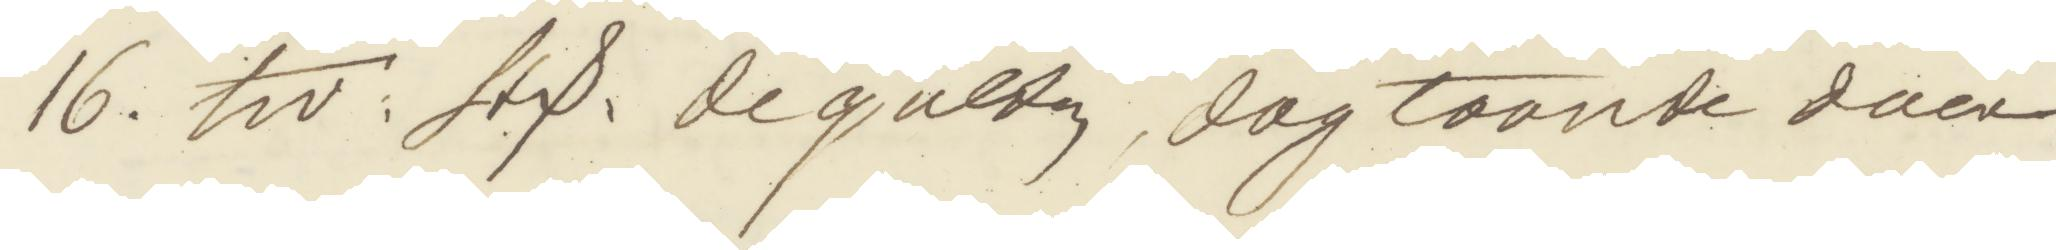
16. tw: stver: de gulden, dog toonde daer
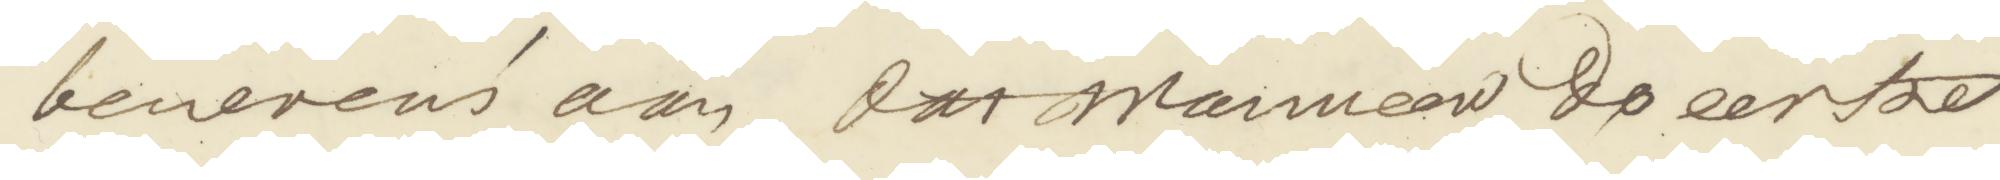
benevens aan, dat wanneer de eerste
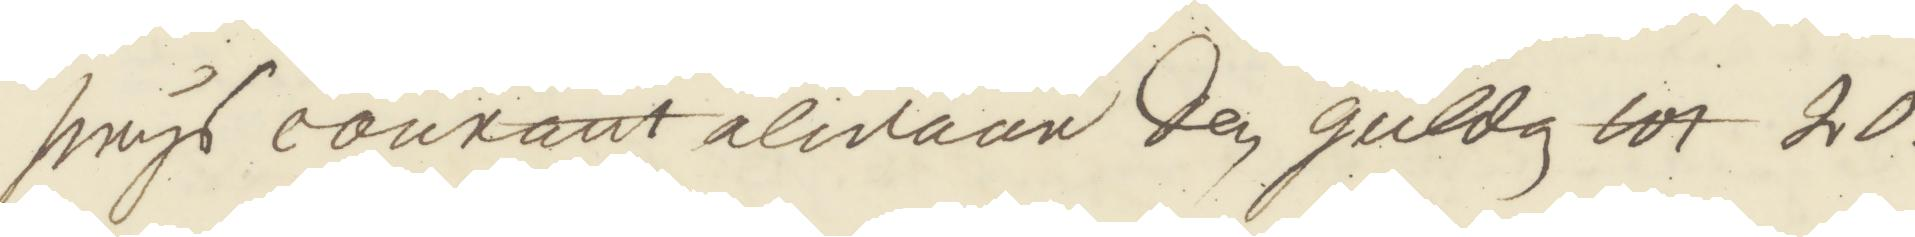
prijs courant alwaar den gulden tot 20.
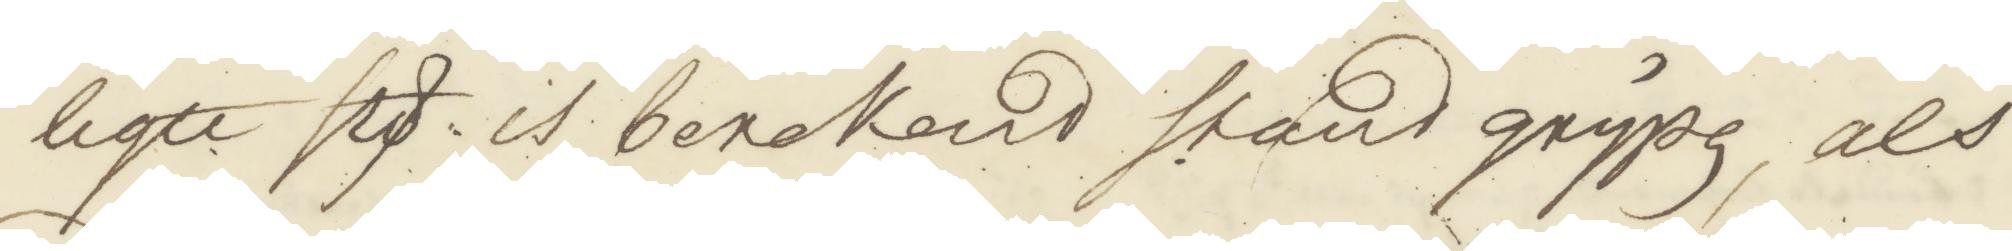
ligte stver: is berekend stand grijpen, als
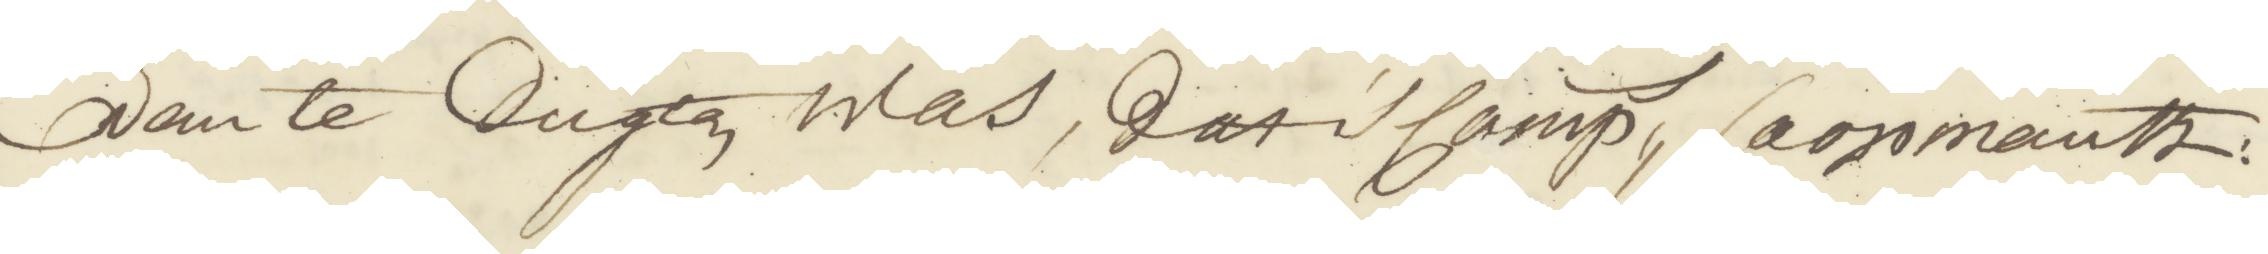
dan te dugten was, dat ’s Comp„s Coopmansz:
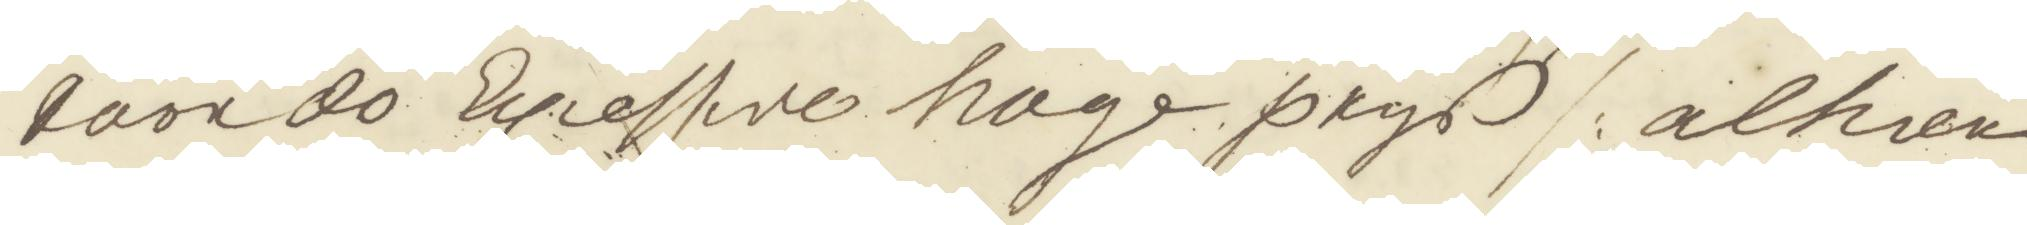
door so Excessive hoge prijs /:alhier
